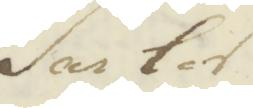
Sarles
